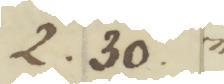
2. 30.
